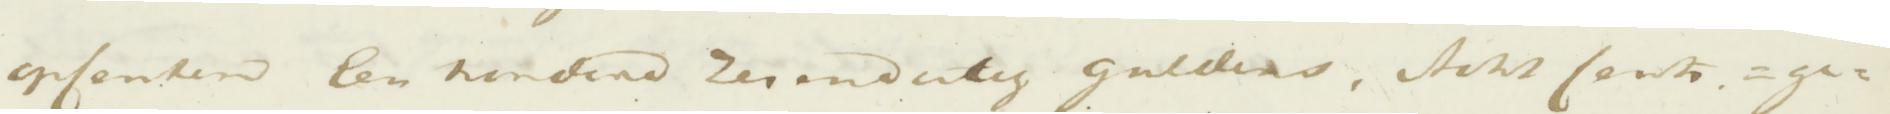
opcenten Een honderd zesendertig guldens, Acht Cents. = ge=
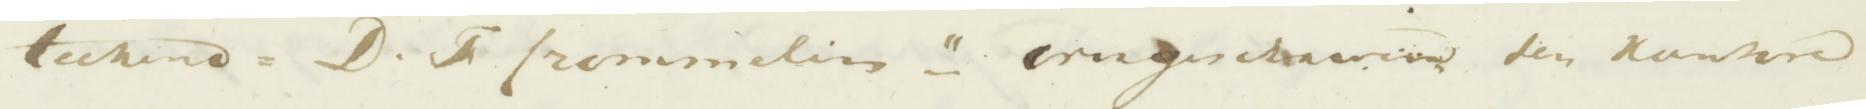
teekend = D: F Crommelin overgeschreven ten kantore
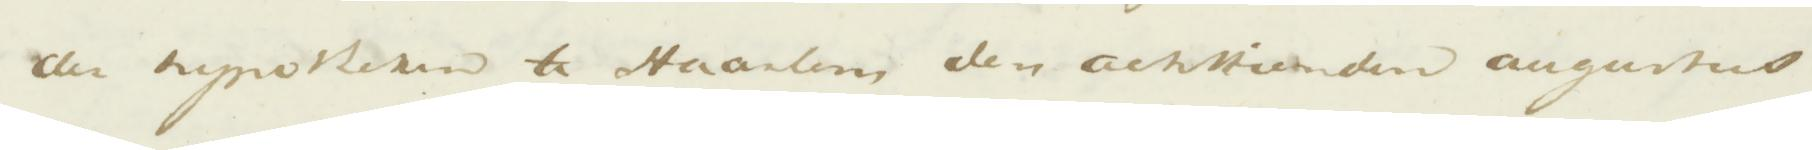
der hypotheker te Haarlem den achttienden augustus
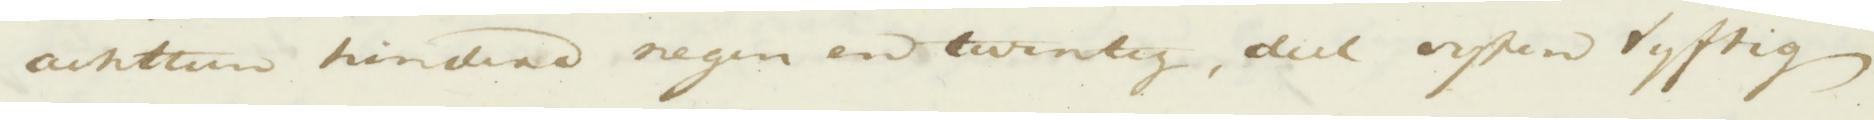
achttien honderd negen en twintig, deel vyfen Vyftig
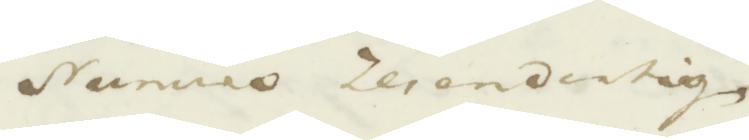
Numero Zesendertig
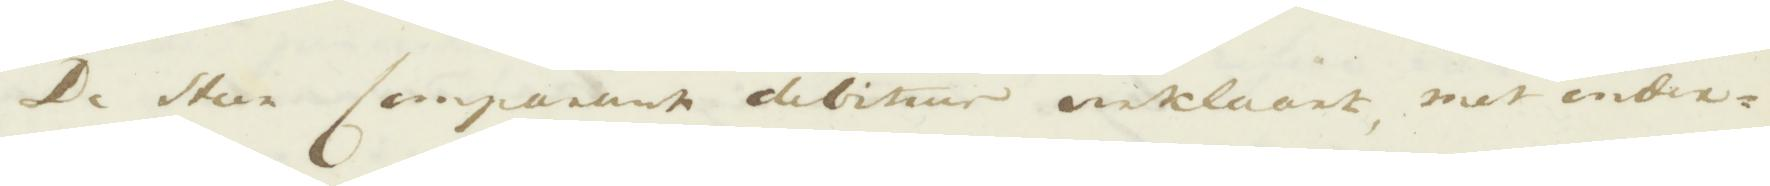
De Heer Comparant debiteur verklaart, met onder=
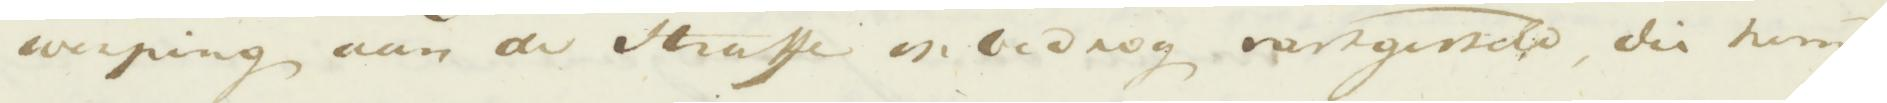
werping aan de straffe op bedrog vastgesteld, die hem
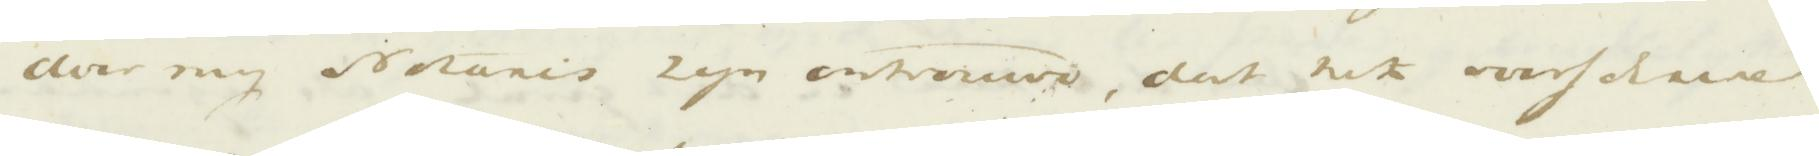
door my Notaris zyn ontvouwd, dat het voorschreve
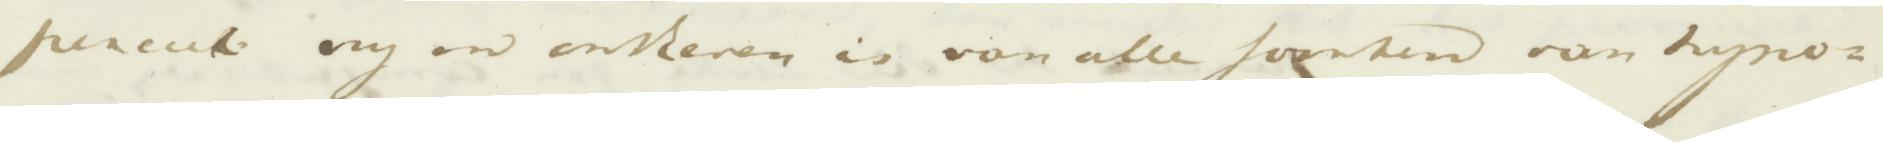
perceel vry en ontheven is van alle soorten van hyno=
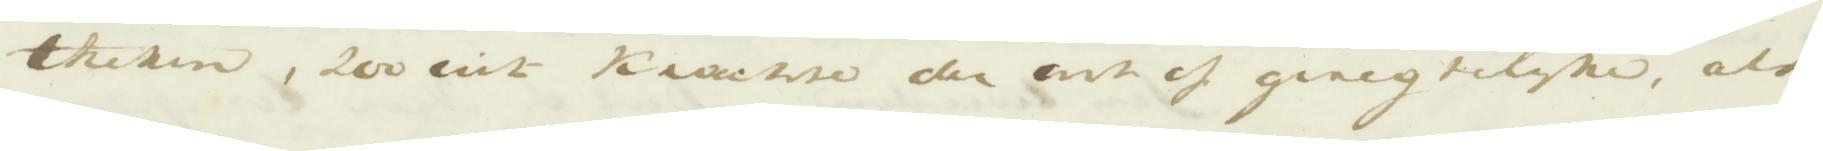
theken, zoo uit krachte den wet op geregtelyke, als
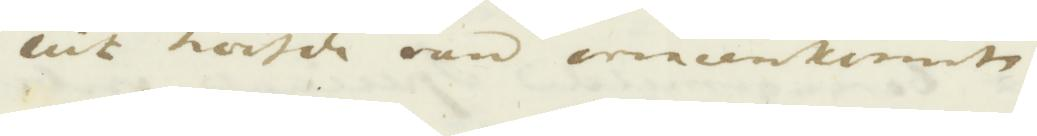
uit hoofde van overeenkomst
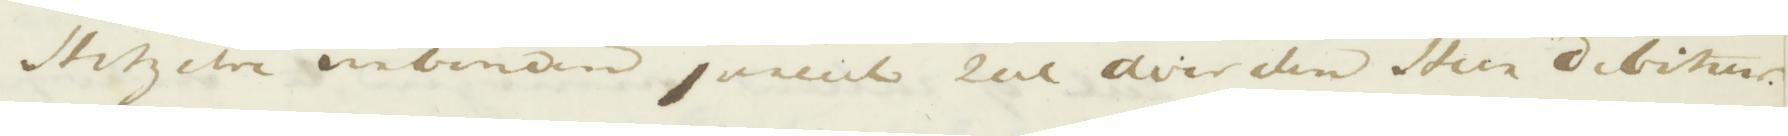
Hetzelve verbonden perceel zal door den Heer debiteur
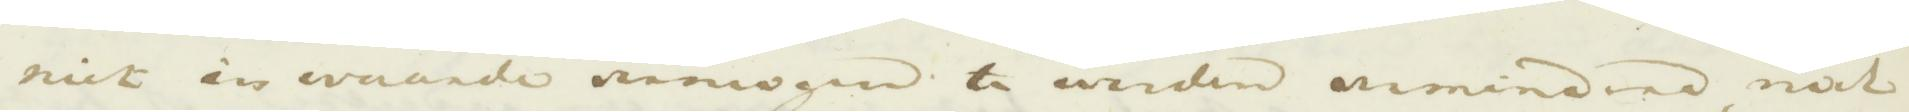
niet in waarde vermogen te worden verminderd, noch
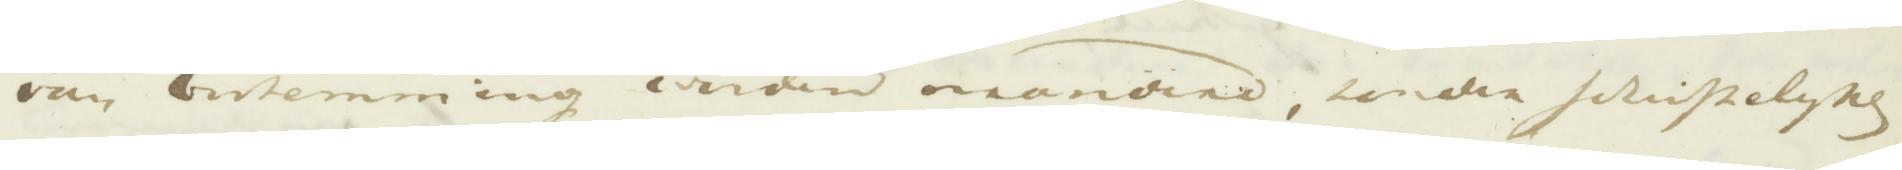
van bestemming worden veranderd zonder schrifelyken
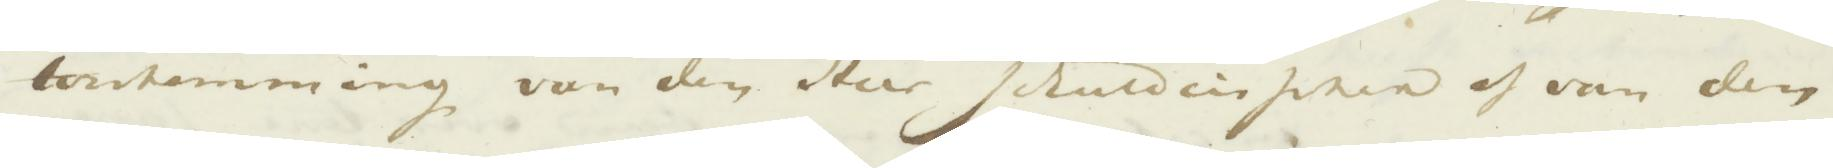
toestemming van den Heer schuldeisscher of van den
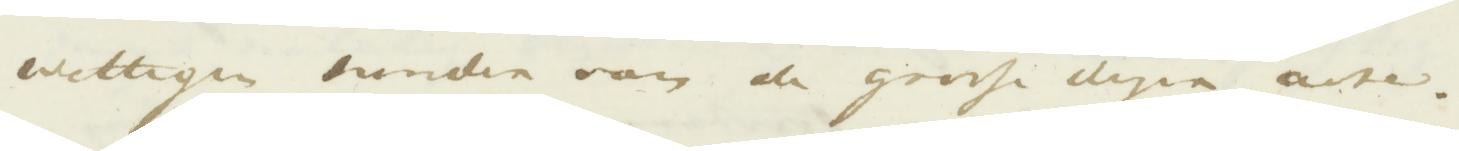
wettigen houder van de grosse dezer acte.
